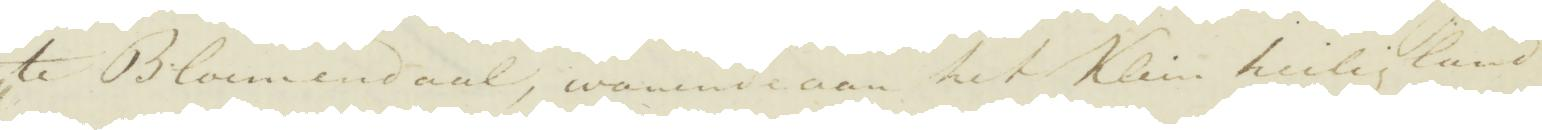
te Bloemendaal, wonende aan het Klein heiligland
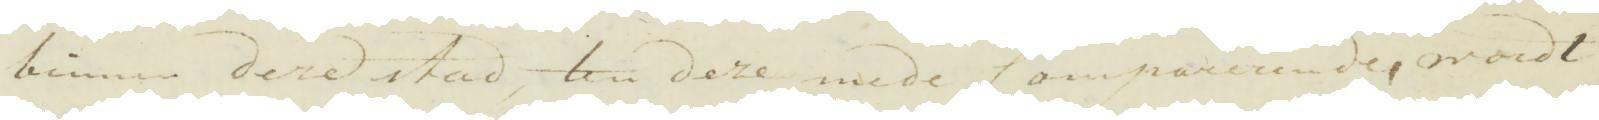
binnen deze stad, ten deze mede Comparerende, wordt
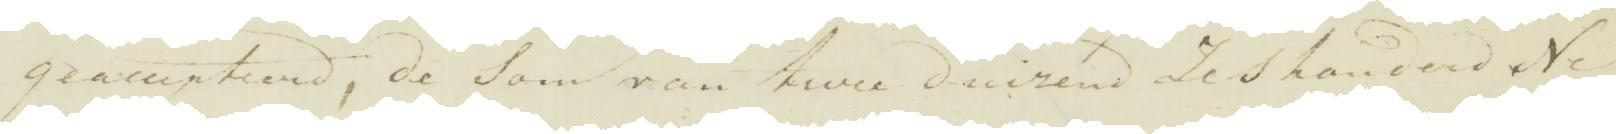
geaccepteerd, de som van twee duizend zes honderd Ne
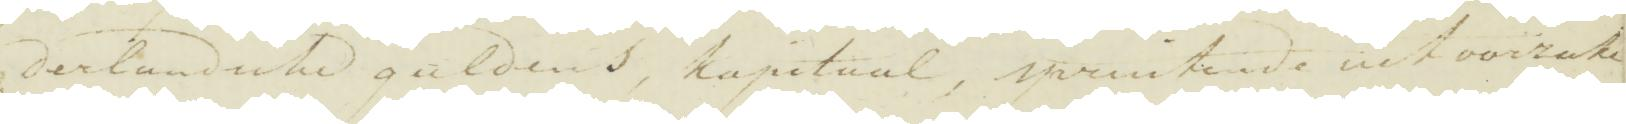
derlandsche guldens, kapitaal, spruitende uit oorzake
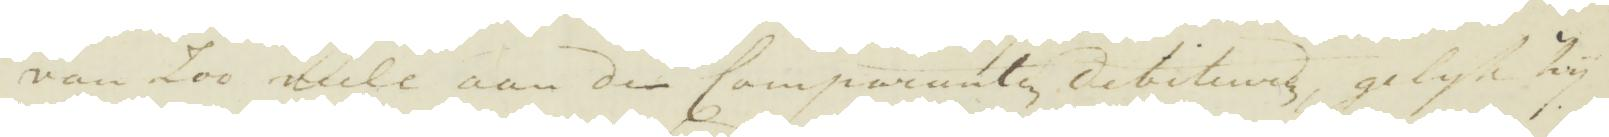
van zoo veele aan den Comparanten debiteuren, gelyk zij
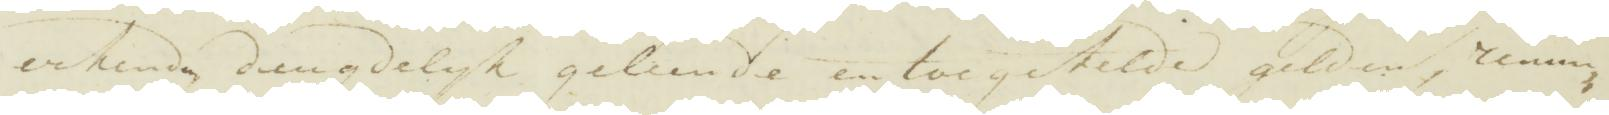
erkenden deugdelyk geleende en toegetelde gelden, renun
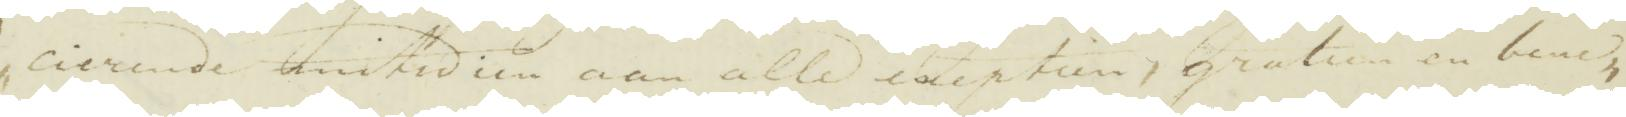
„cierende mitsdien aan alle exeptien, gratien en bene„
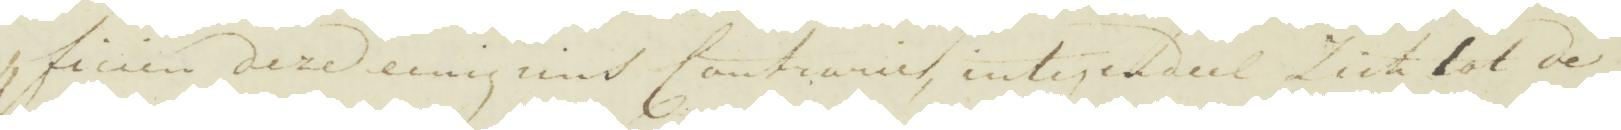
ficien deze eenig uit Contrarie, integendeel zich tot de
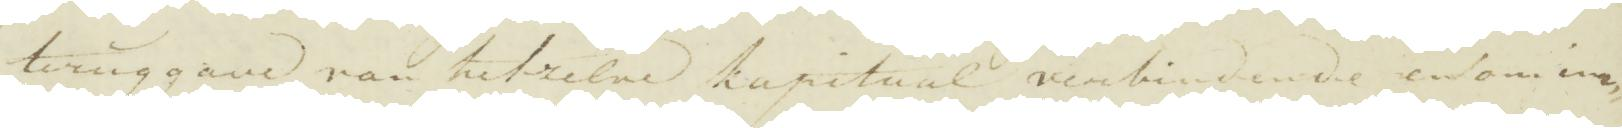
teruggave van hetzelve kapitaal verbindende en om in„
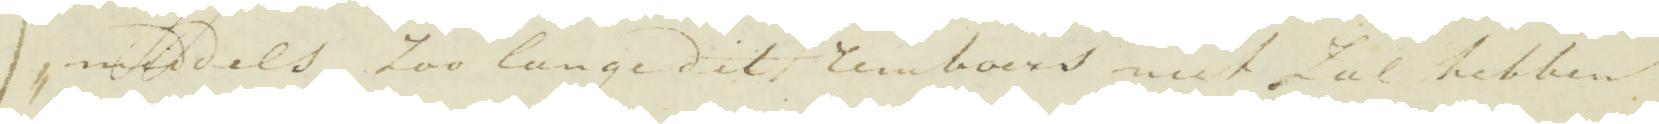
„middels, zoo lange dit remboers niet zal hebben
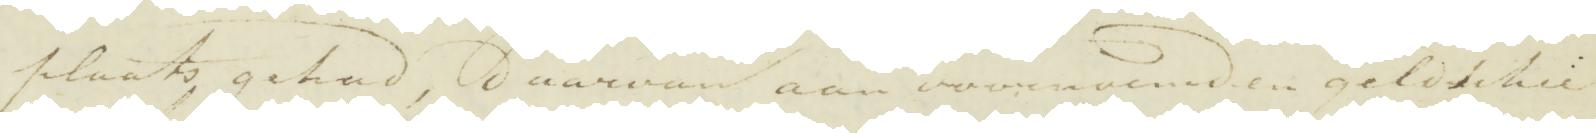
plaats gehad, daarvan aan voornoemden geldschie
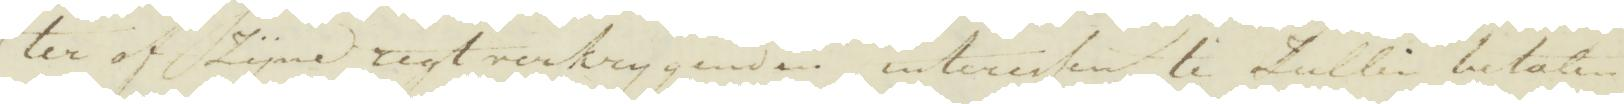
ter of zijne regt verkrygenden, interessen te zullen betalen
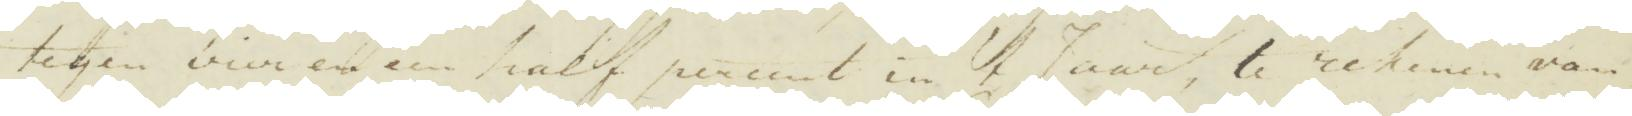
tegen vier en een half percent in 't Jaar, te rekenen van
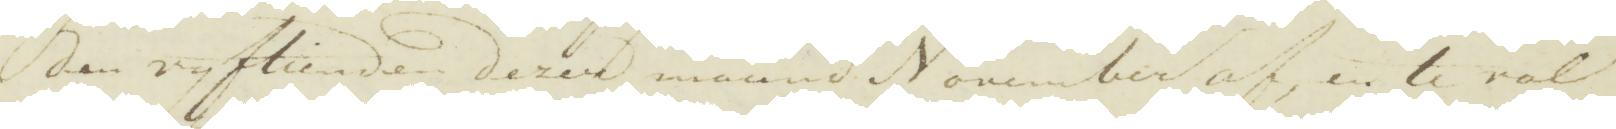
den vyftienden dezer maand November af, en te vol
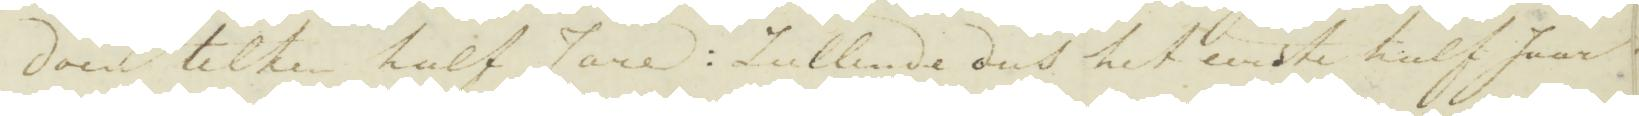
doen telke half Jare: zullende dus het eerste half Jaar
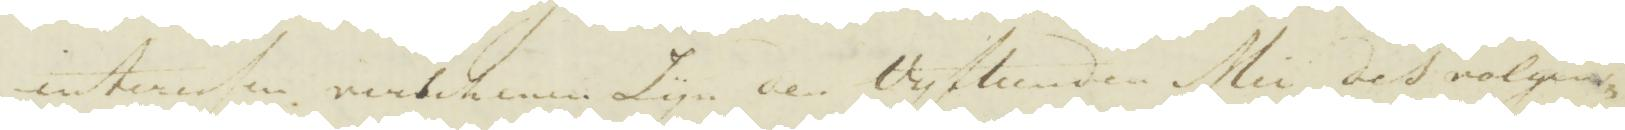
interessen. verschenen zijn den Vijftienden Mei des volgen„
